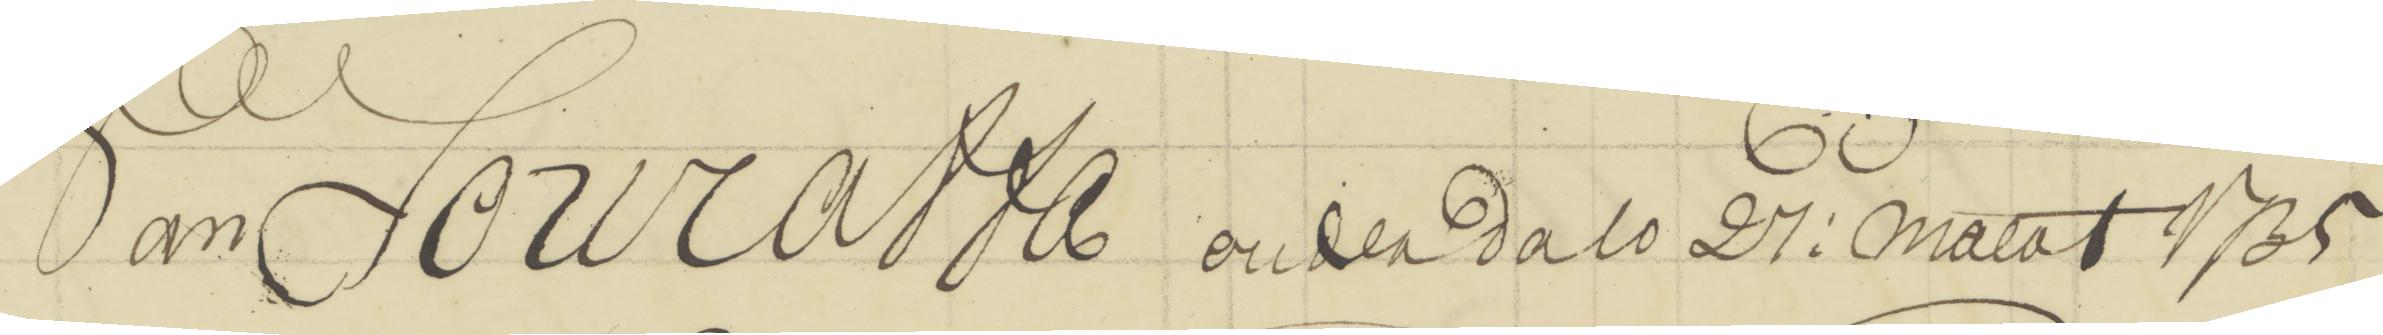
Van Souratta onderdato 27:e maert 1735
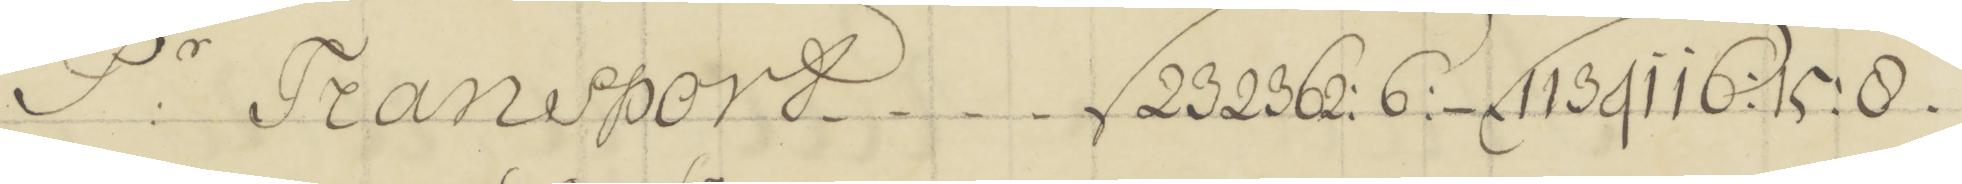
P:r Transport - - - - ƒ 232362: 6: — ƒ 1134116: 15: 8.
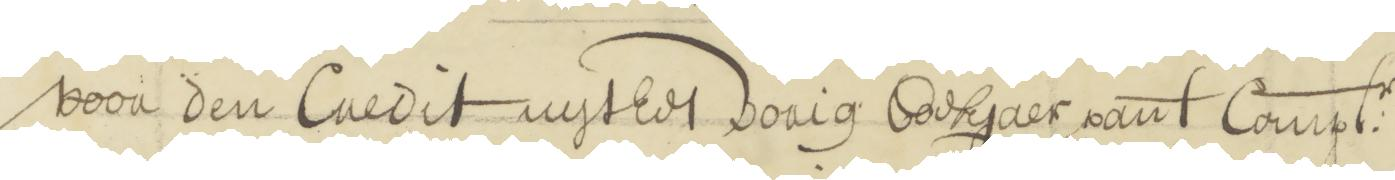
voor den Credit uythet Vorig boekjaer van t Compt:r
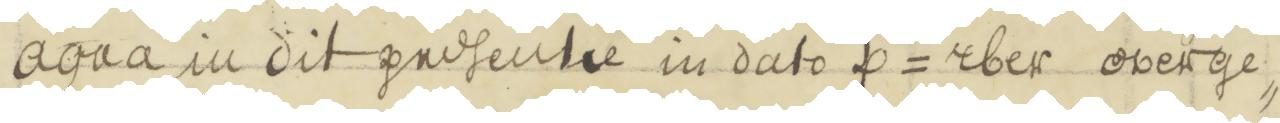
agra in dit presente in dato p=mo tber overge„
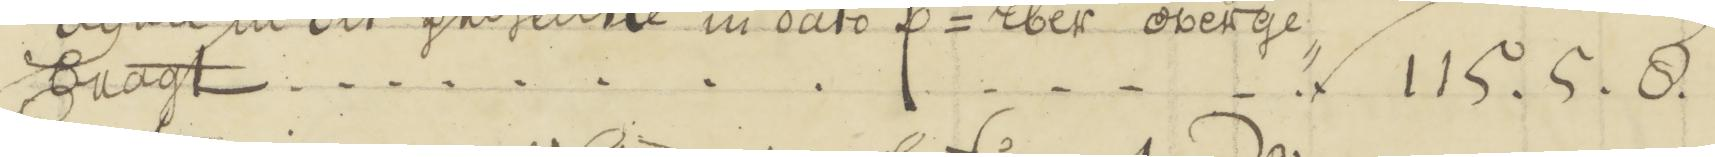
bragt - - - - - - - - - - - - - . ƒ 115. 5. 8.
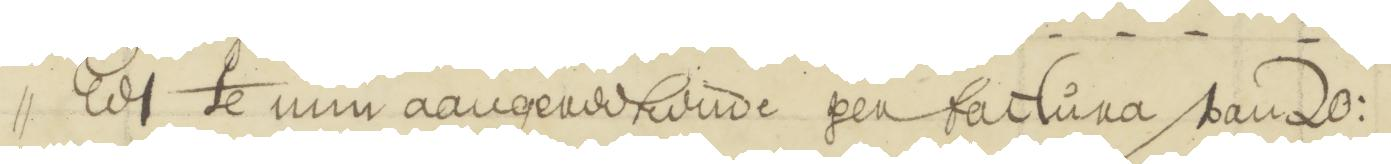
„ het te min aangereekende per factura van 20:
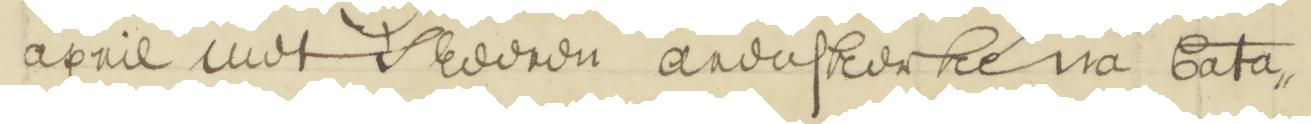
april met 's heeren arenskerke na bata„
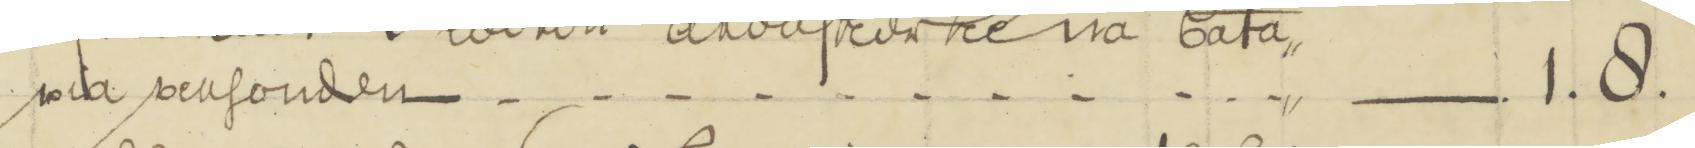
via versonden - - - - - - - - - - - „ —. 1. 8.
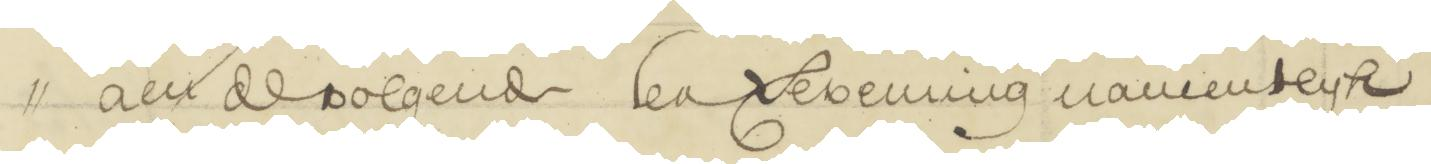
„ aen de volgende ter vereveming namentlyk
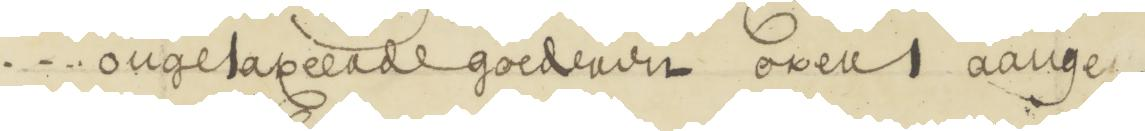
- - - . ongetaxeerde goederen over 1 aange„
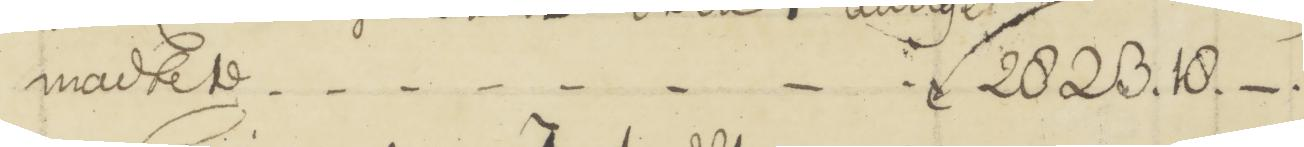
maekte - - - - - - - - ƒ 2823. 18. —.
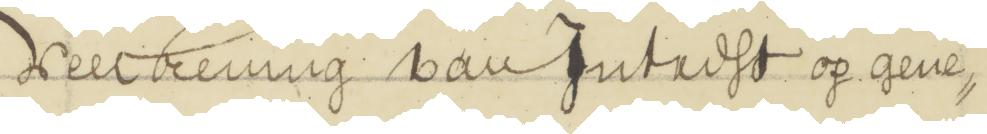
Reeckening van Jntrest op gene„
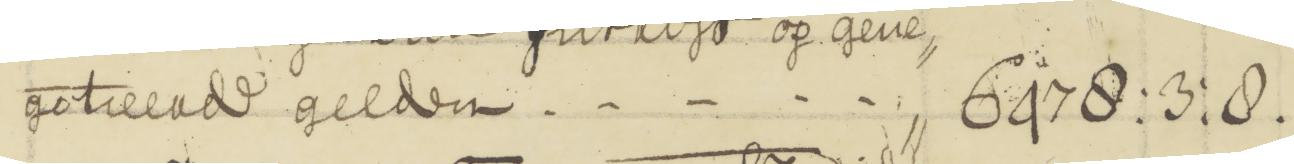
gotieerde gelden - - - - - : „ 6478: 3: 8.
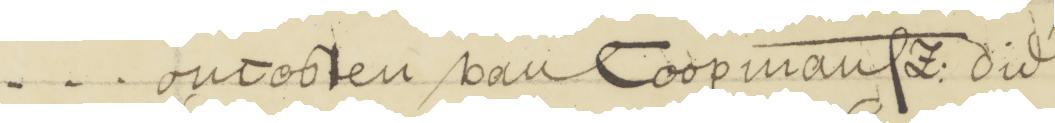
- - - oncosten van Coopmansz: die
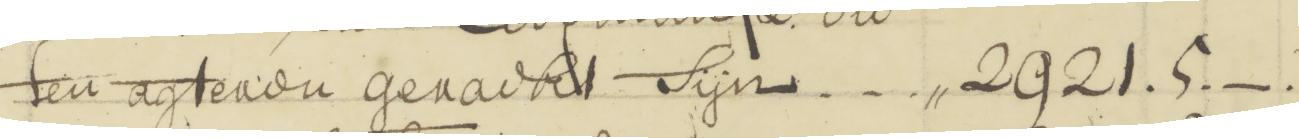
ten agteren geraekt sijn - - - „ 2921. 5. —.
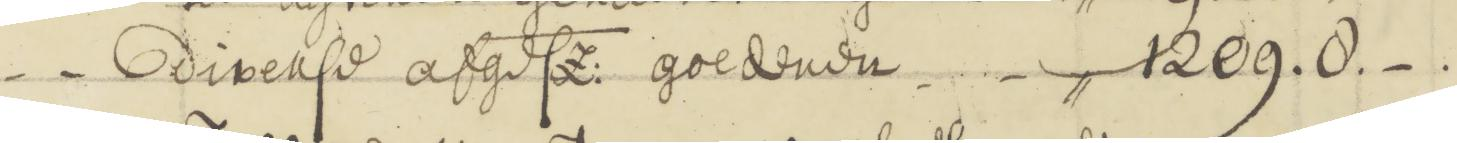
- - diverse afgesz: goederen - .. - „ 1209. 8. —.
